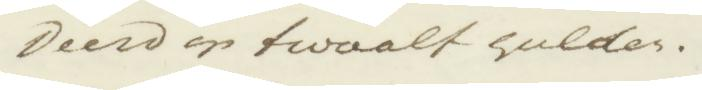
deerd op twaalf gulden.
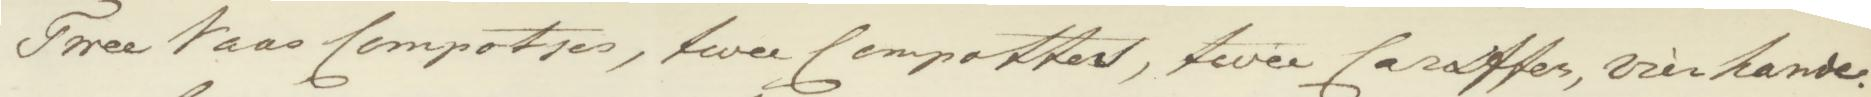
Twee Vaas Compotjes, twee Compotten, twee Caraffen, vier kande
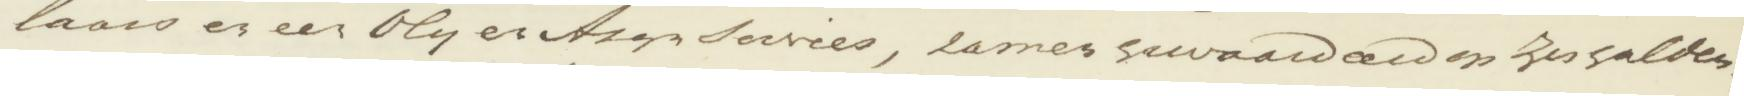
laars en een Oly en Azyn servies, zamen gewaardeerd op Zes gulden,
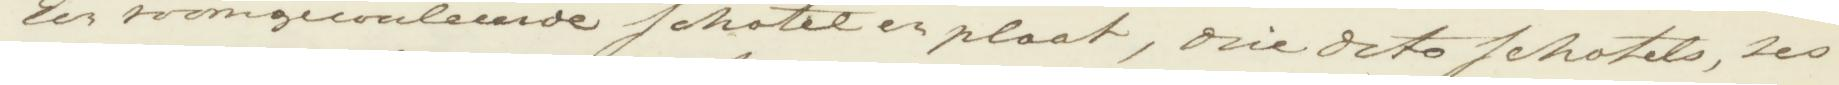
Een roomgecouleurde schotel en plaat, drie dito schotels, zes
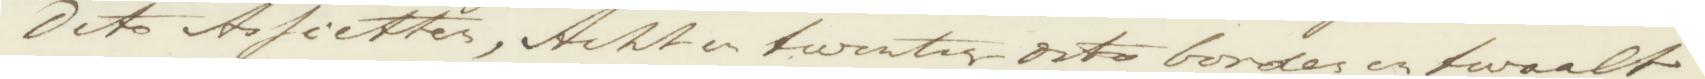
dito Assietten, Acht en twintig dito borden en twaalf
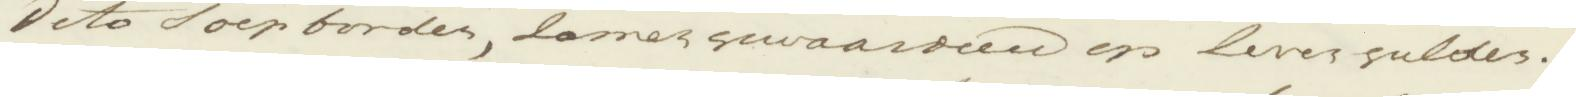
dito soepborden, zamen gewaardeerd op Zeven gulden.
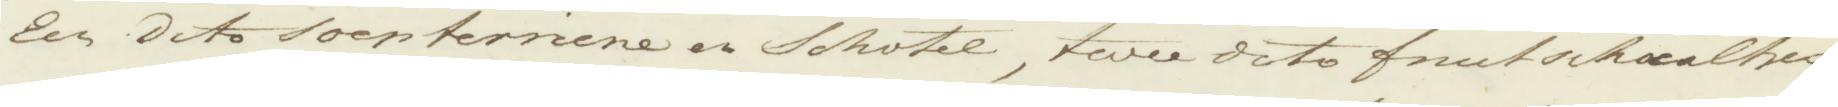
Een dito soepterriene en schotel, twee dito fruitschaaltjes
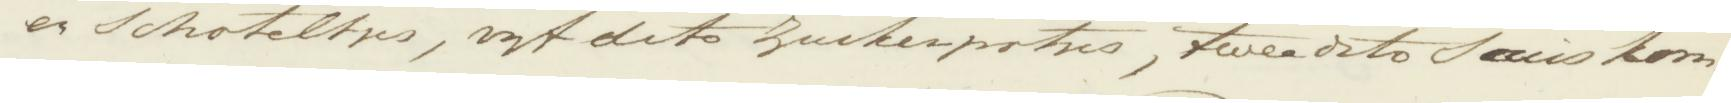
en schoteltjes, vyf dito zuikerpotjes, twee dito saus kom.
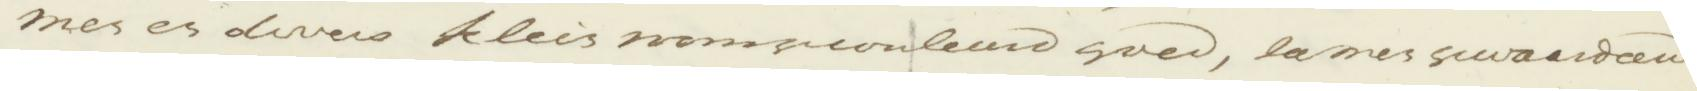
men en divers klein roomgecouleurd goed, zamen gewaardeerd
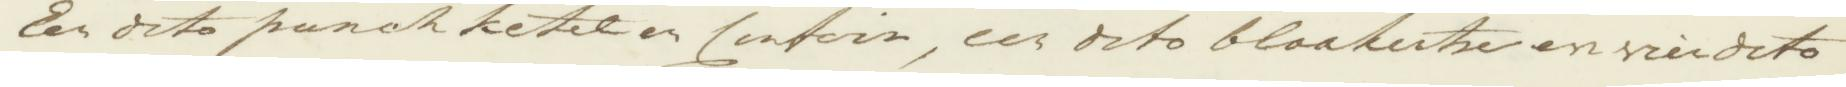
Een dito punchketel en Confoir, een dito blaakertje en vier dito
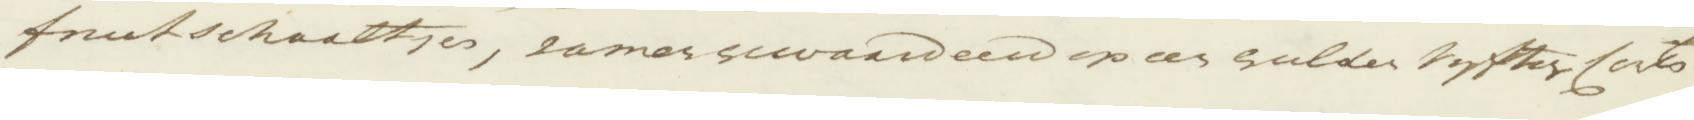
fruitschaaltjes, zamen gewaardeerd op een gulden vyftig Cents
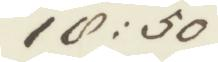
18: 50
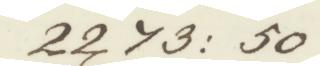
2273: 50
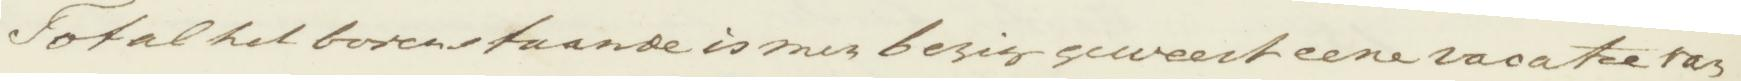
Tot al het bovenstaande is men bezig geweest eene vacatie van
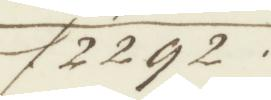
ƒ2292
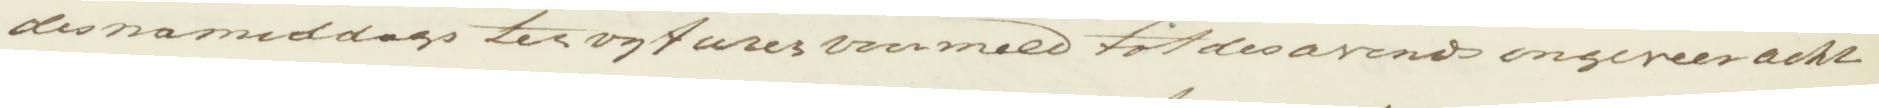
des namiddags ten vyf uren voormeld tot des avonds ongeveer acht
